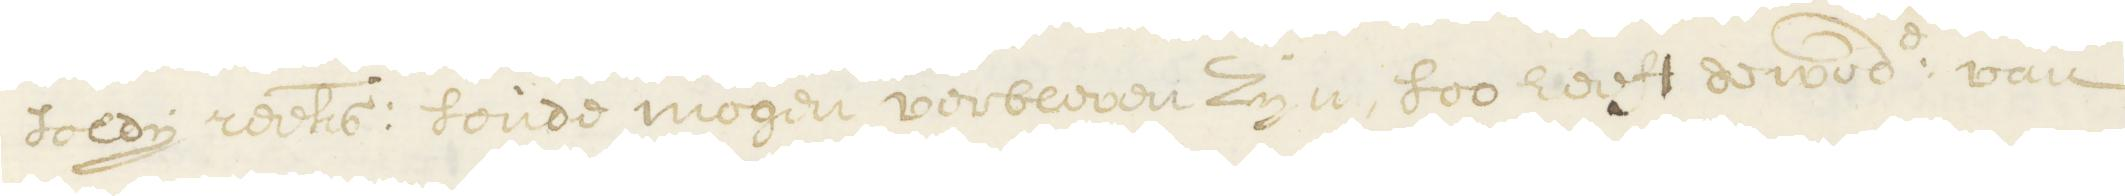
soldij reeks: soude mogen verbleven zijn, soo heeft de wed:e van
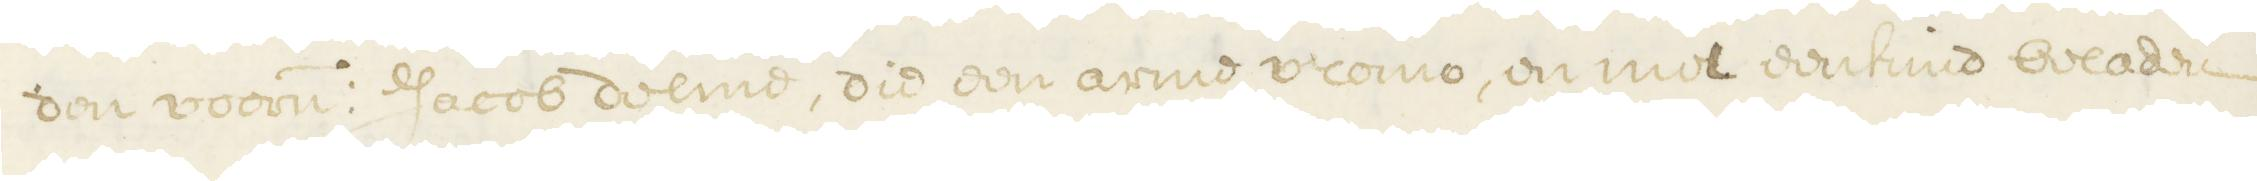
den voorn: Jacob deline, die een arme vrouw, en met een kind beladen
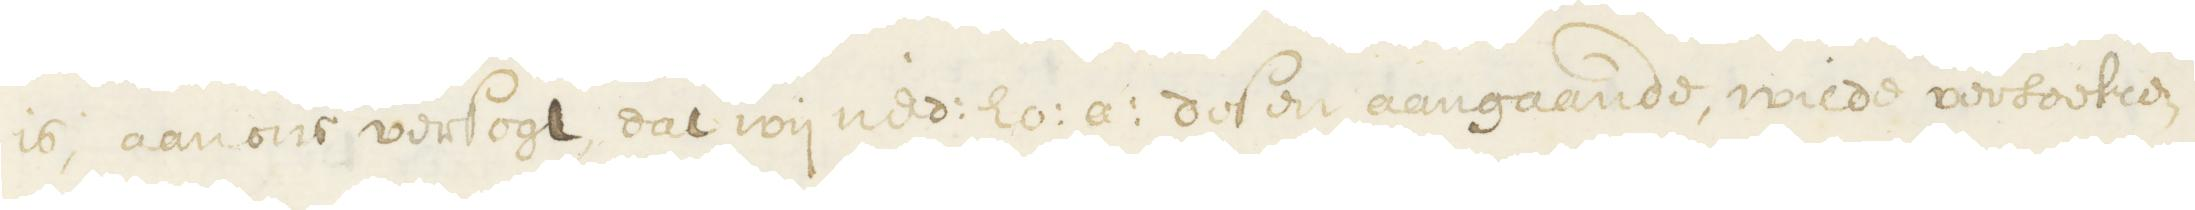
is, aan ons versogt, dat wij uEd: ho: a: desen aangaande, wilde versoeken
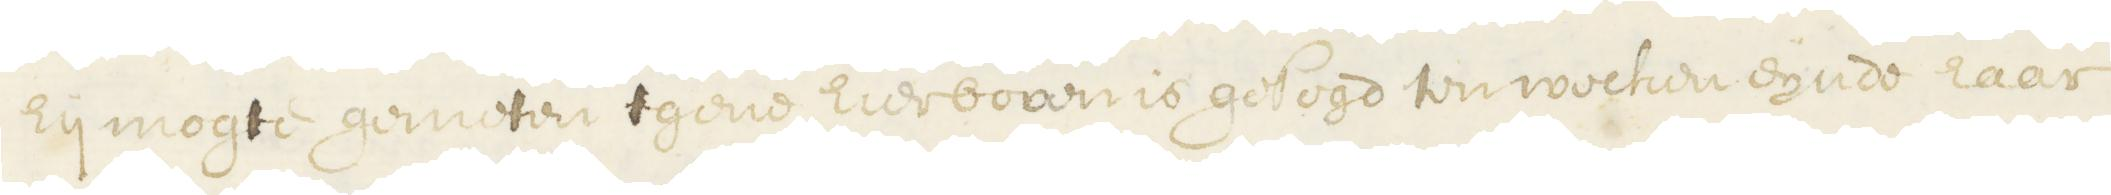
hij mogte genieten 'tgene hierboven is gesegd ten welken eijnde haar
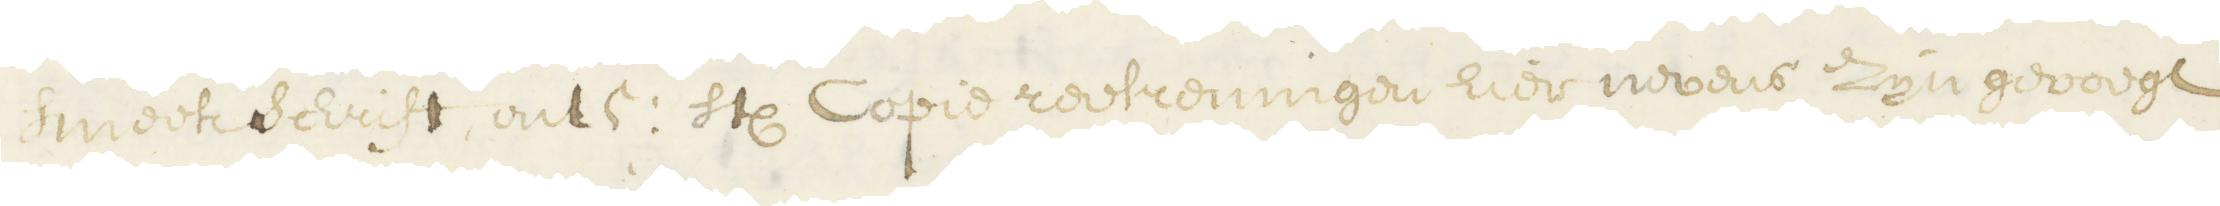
smeekschrift, en 15: stx Copie reekeningen hier nevens zijn gevoegt
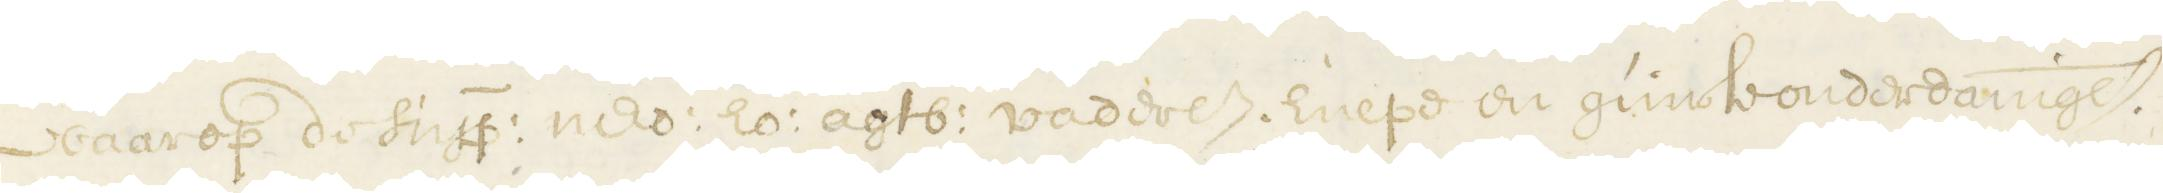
waarop de supp: uEd: ho: agtb: vaderlijke hulpe en gunste onderdaniglijk
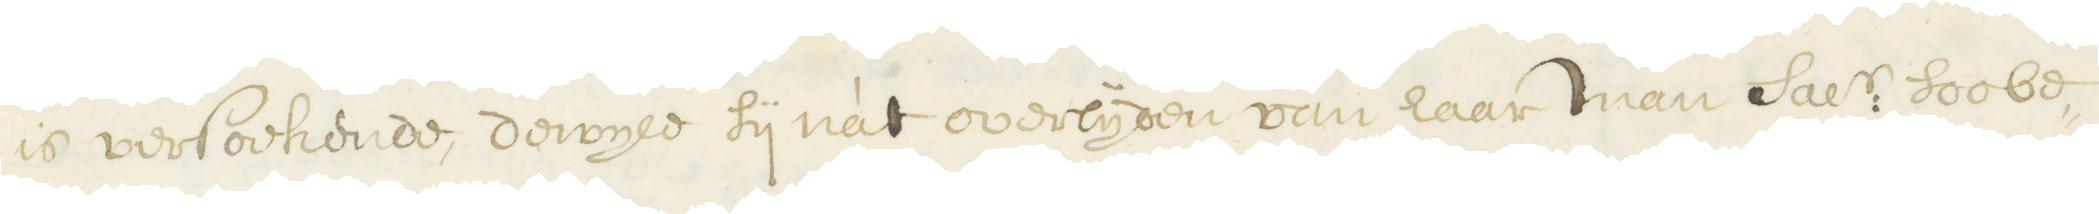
is versoekende, dewijle sij na't overlijden van haar man sal:r soo be„
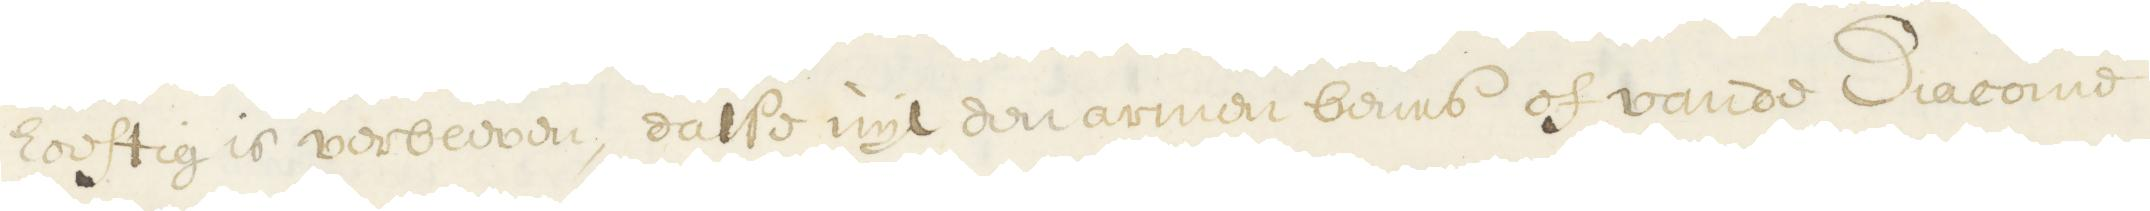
hoeftig is verbleven, datse uijt den armen beurs of vande Diaconie
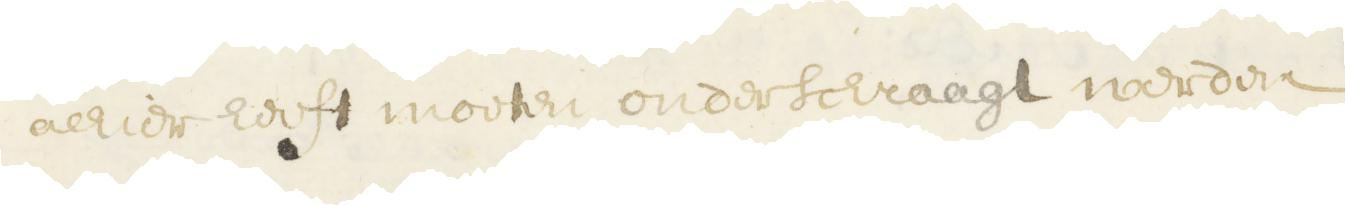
alhier heeft moeten onderschraagt werden
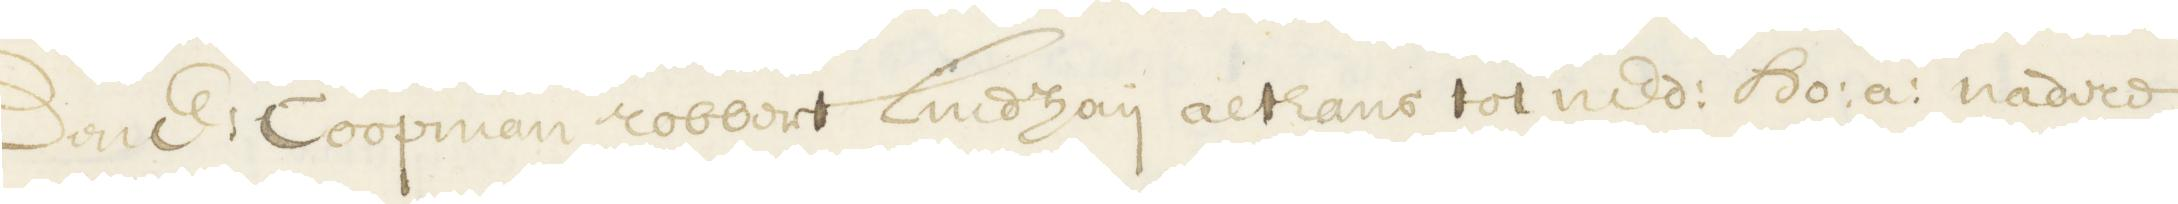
Den E: Coopman robbert lindzaij althans tot uEd: Ho: a: nadere
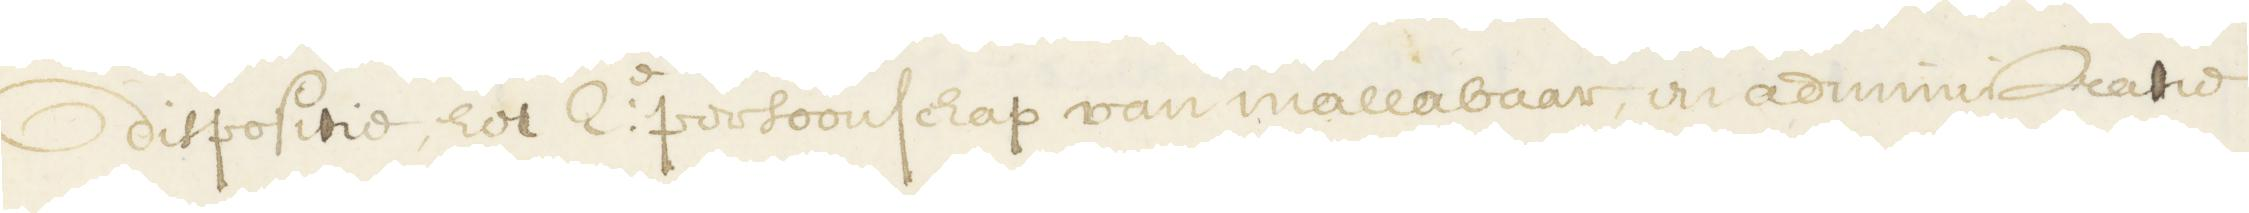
dispositie, het 2:e persoonschap van mallabaar, en administratie
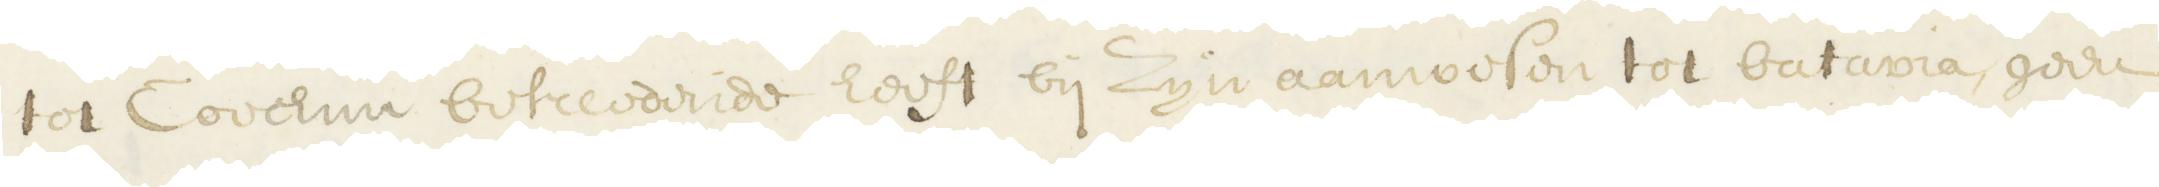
tot Coechim bekledende heeft bij zijn aanwesen tot batavia, geen
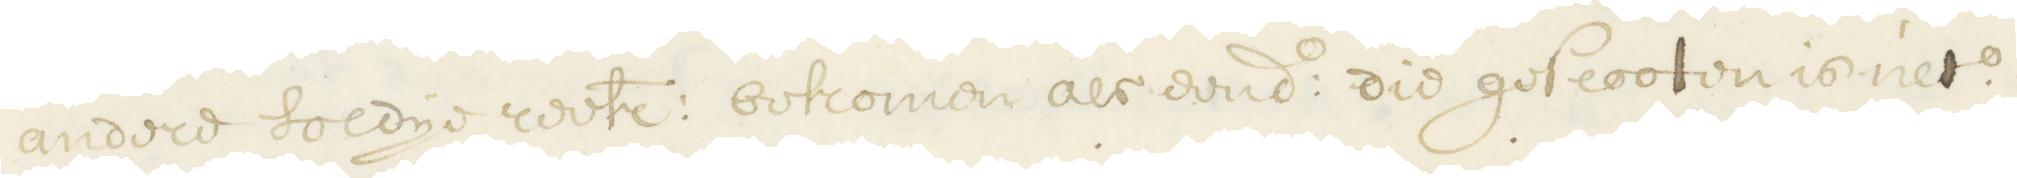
andere soldije reek: bekomen als een d:o die geslooten is ult.o
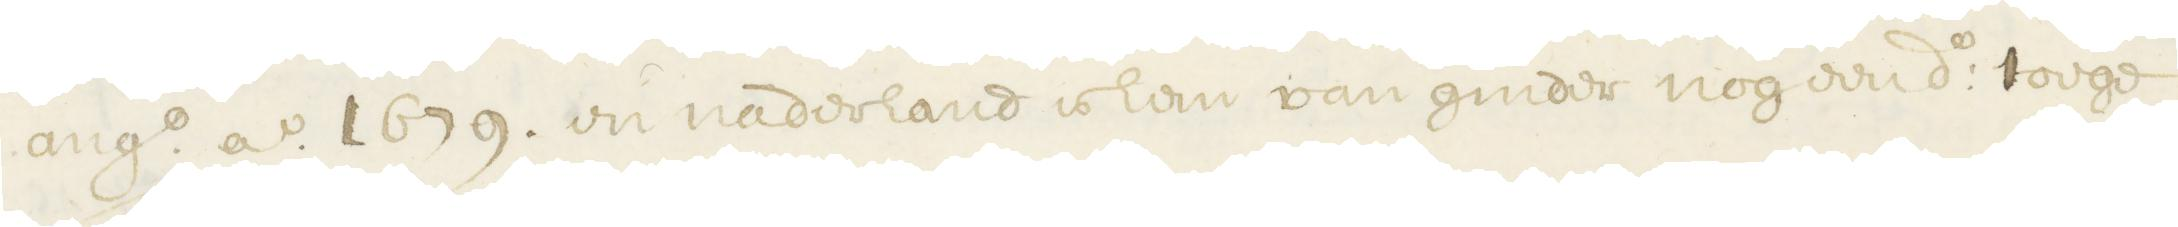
aug.o a.o 1679. en naderhand is hem van ginder nog een d:o toege
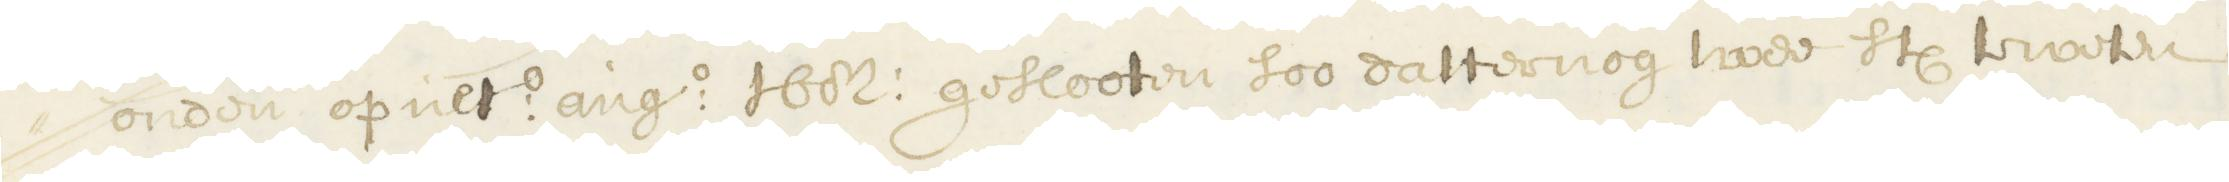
„sonden op ult:o aug:o 1682: geslooten soo datter nog twee stx teweten
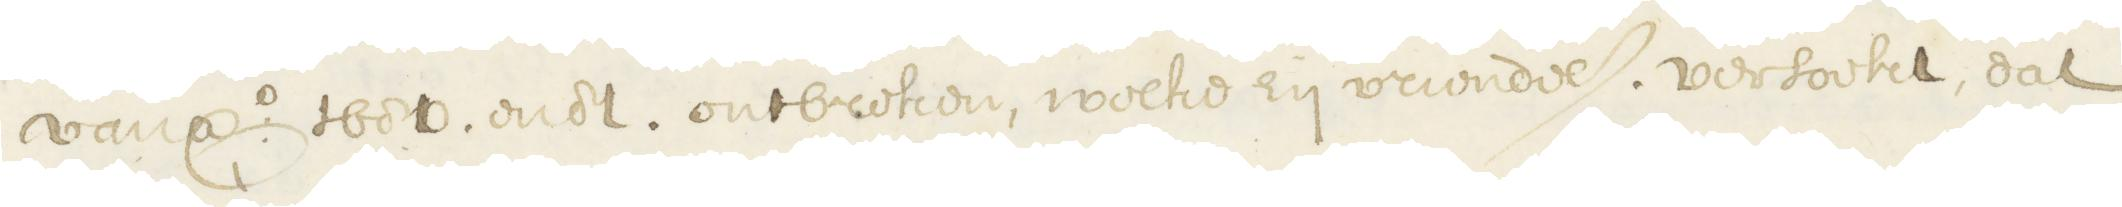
van a:o 1680. en 81. ontbreken, welke hij vriendelijk versoekt, dat
